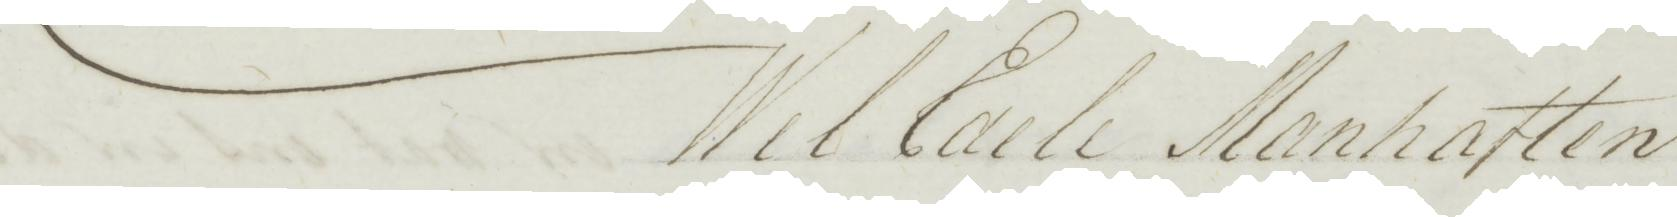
Wel Edele Manhaften
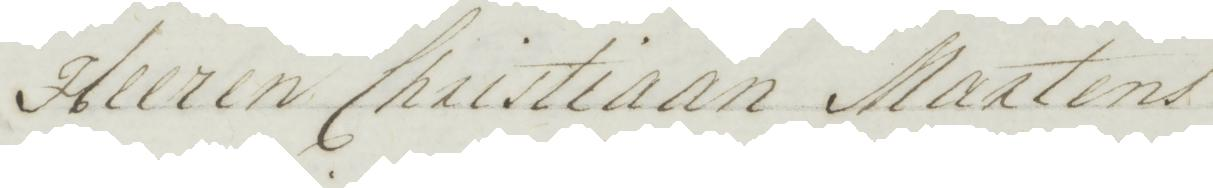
Heeren Christiaan Martens
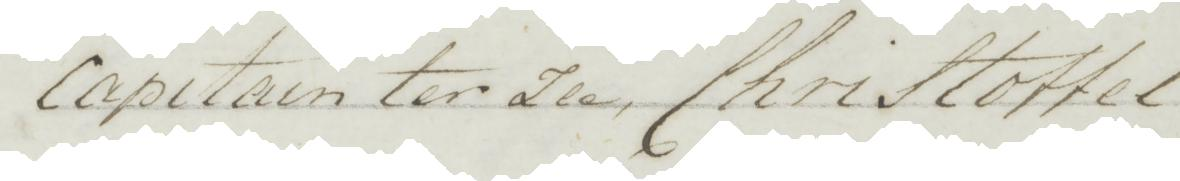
Capitain ter zee, Christoffel
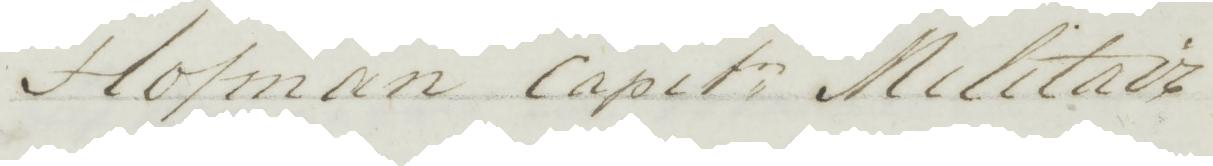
Hofman Capit„n Militair
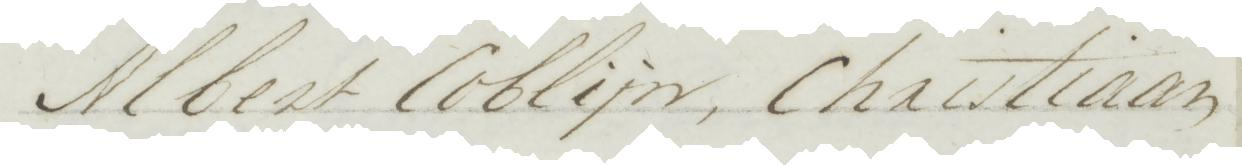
Albert Coblijn, Christiaan
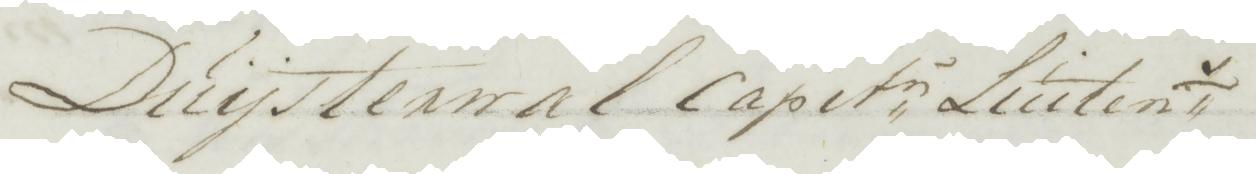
Duijsterwal Capit„n Luiten„s
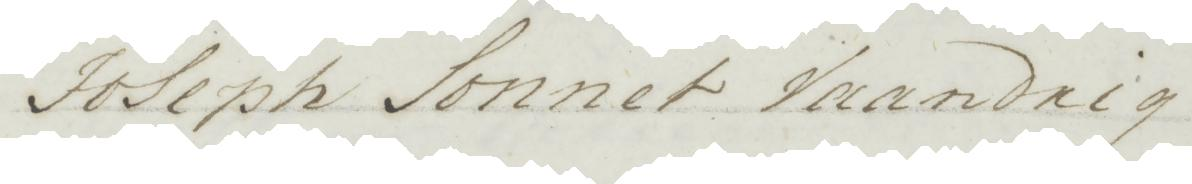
Ioseph Sonnet Vaandrig
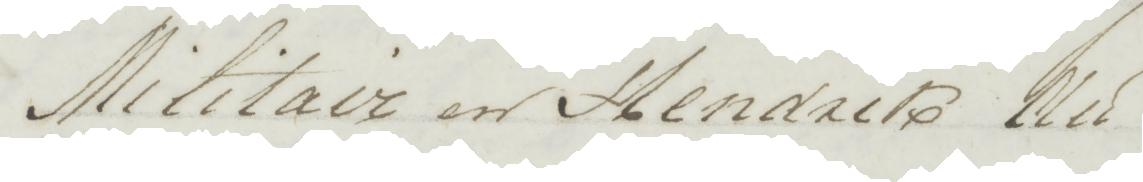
Militair en Hendrik der
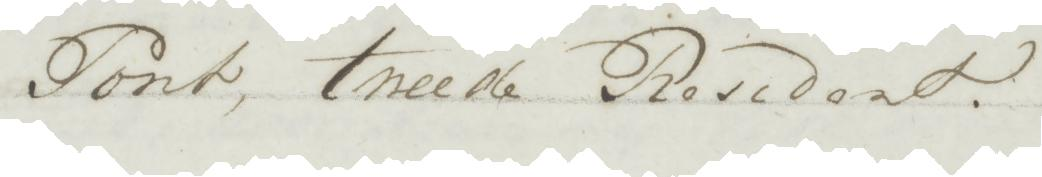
Pont, tweede Resident.
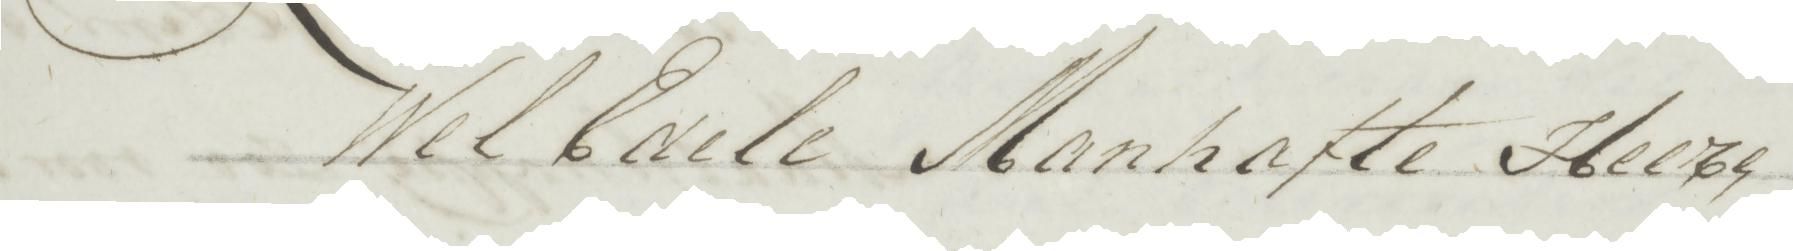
Wel Edele Manhafte Heere
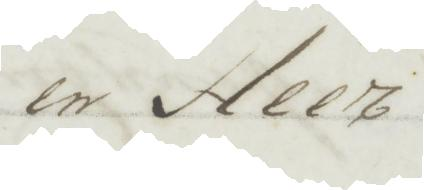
en Heer
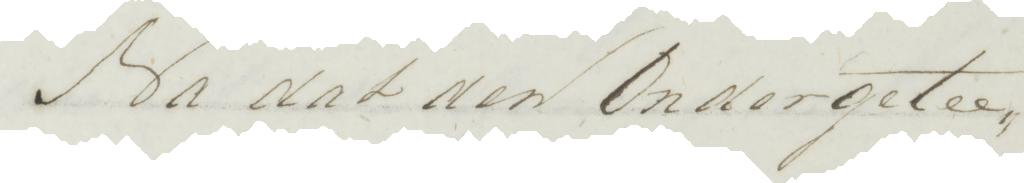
Na dat den Ondergetee„
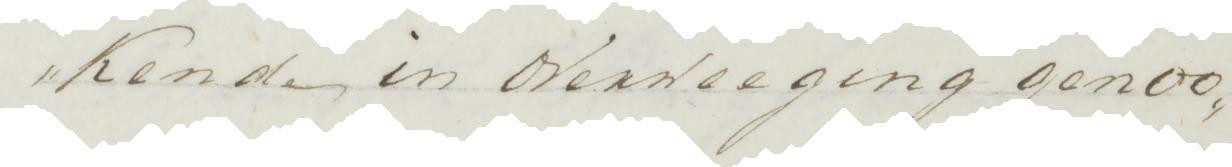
„kende in overweeging genoo„
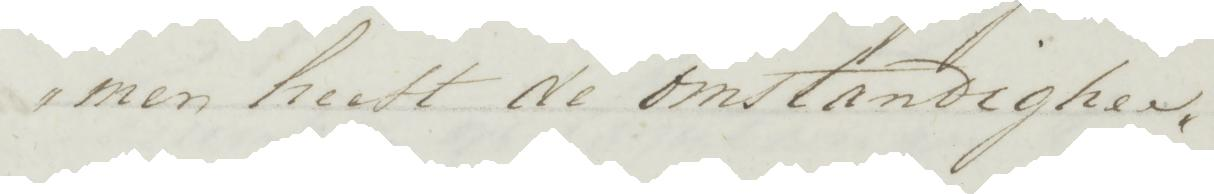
„men heeft de omstandighee„
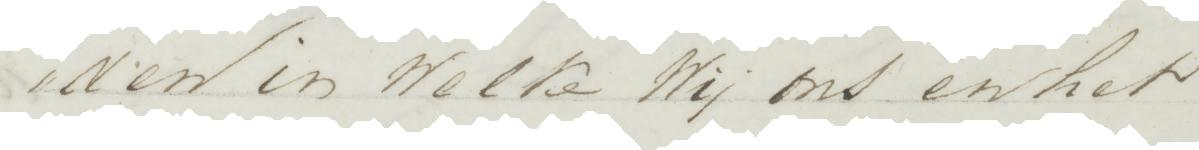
„den in welke wij ons en het
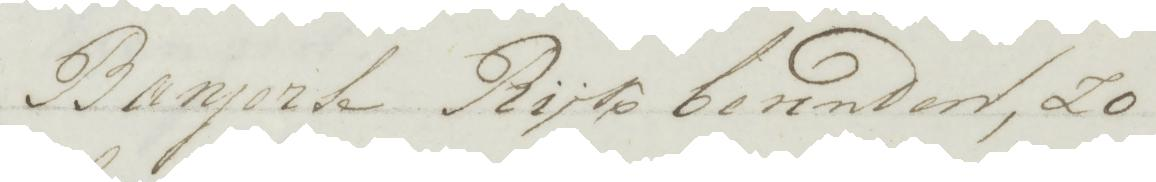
Banjorse Rijk bevinden, zo
